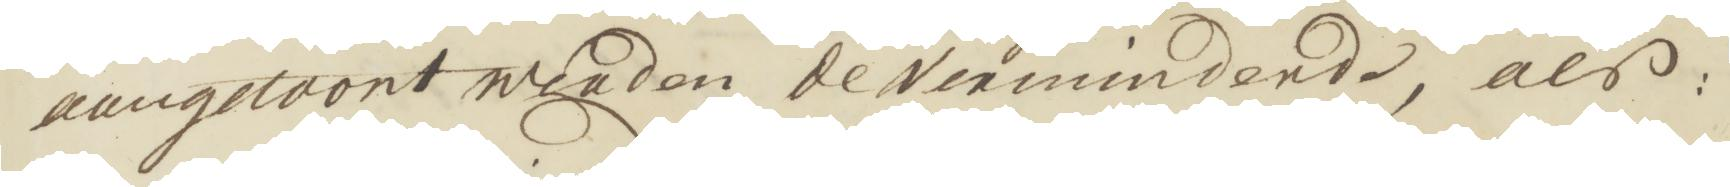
aangetoont werden de verminderde, als:
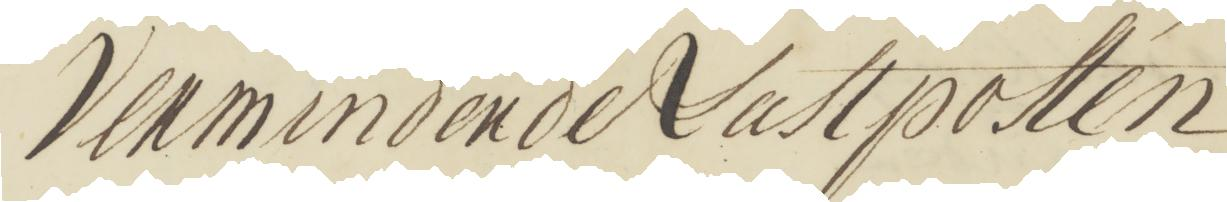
Verminderde Lastposten
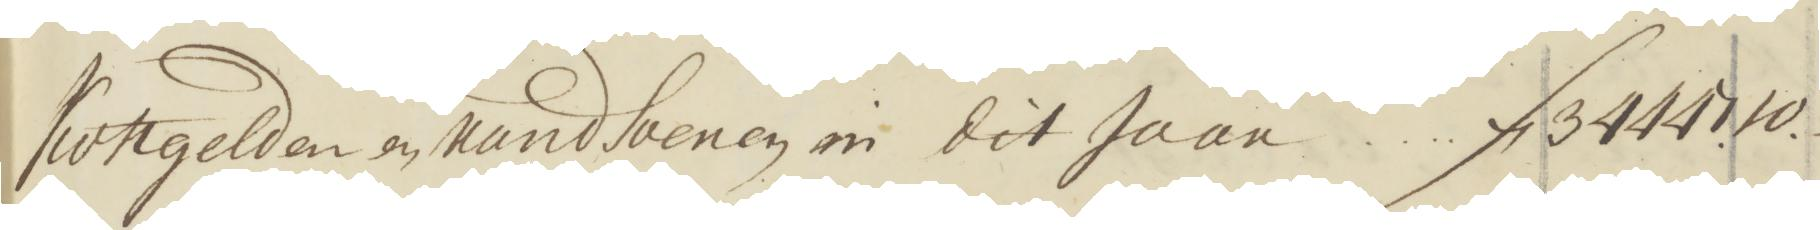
kostgelden en randsoenen in dit jaar . . . . ƒ34447. 10.
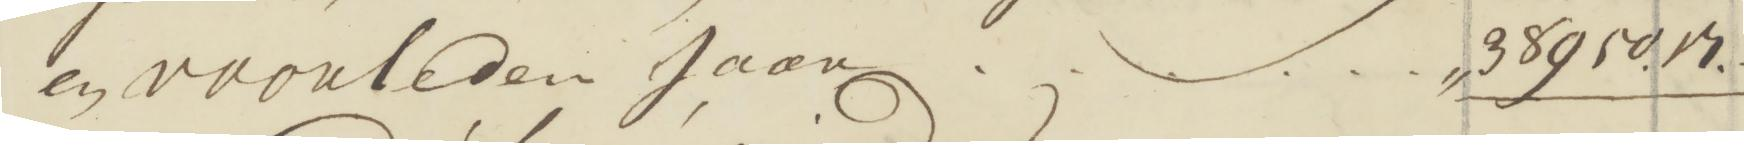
en voorleden jaar . . . . . . „ 38950. 17.
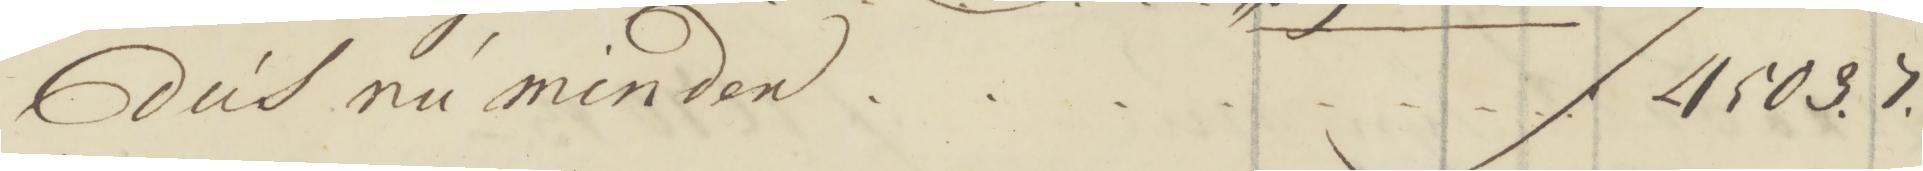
dus nu minder . . . . . . . . . ƒ4503. 7.
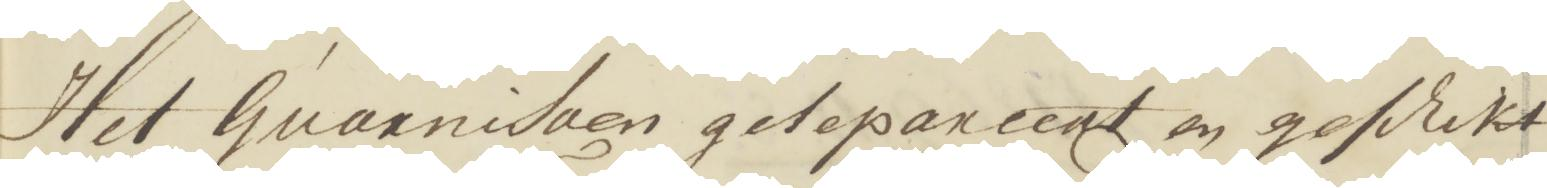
Het Guarnisoen gesepareert en geschikt
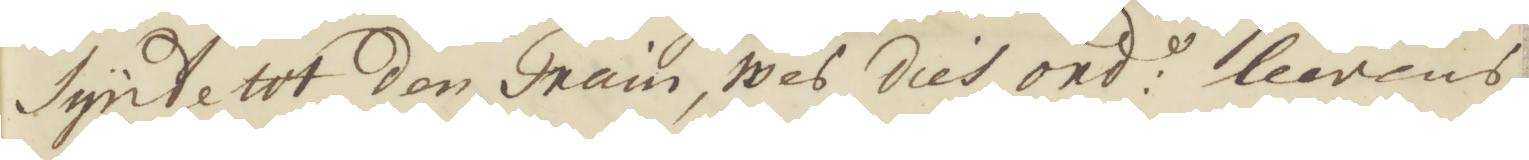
sijnde tot den Train, wes dies ord:e leevens
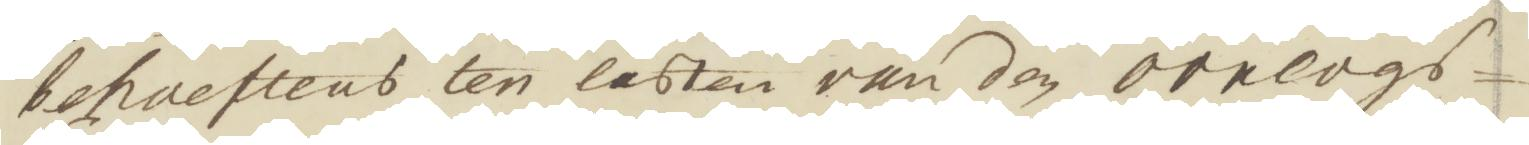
behoeftens ten lasten van den oorlogs=
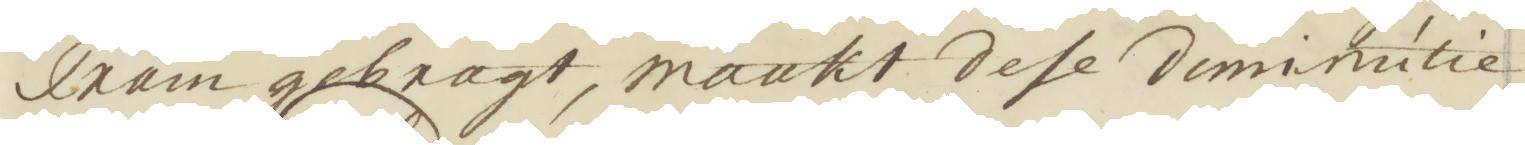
Train gebragt, maakt dese diminutie
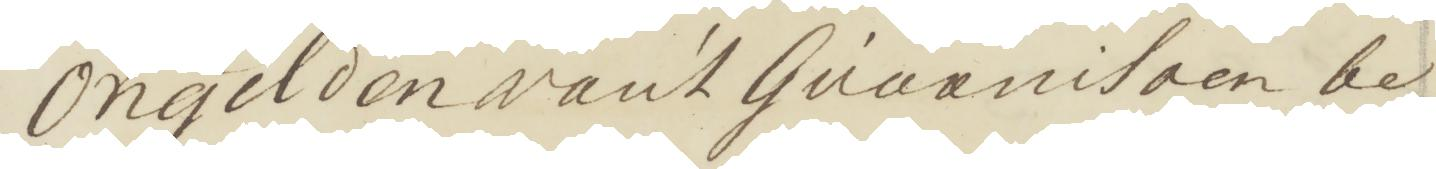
Ongelden van't Guarnisoen be
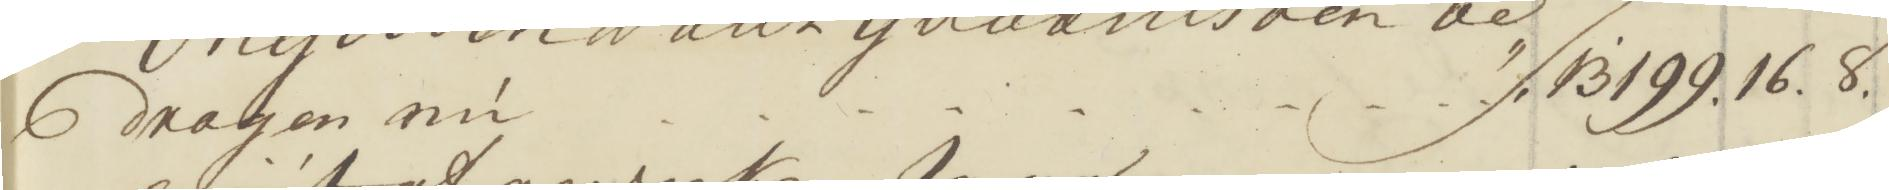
dragen nu . . . . . . . . . . ƒ13199. 16. 8.
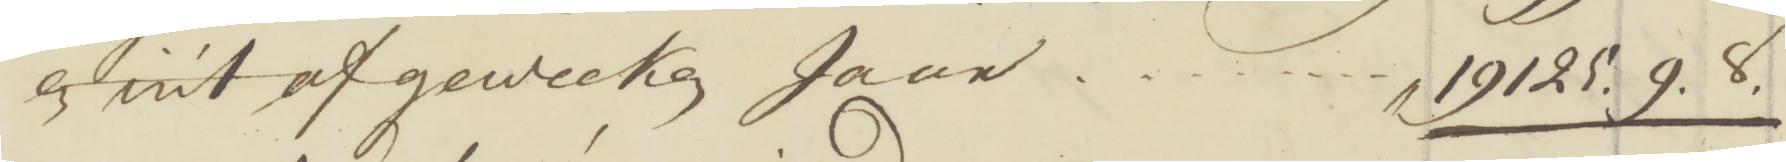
en in't afgeweeken jaar . . . . . . . . . „ 19125. 9. 8.
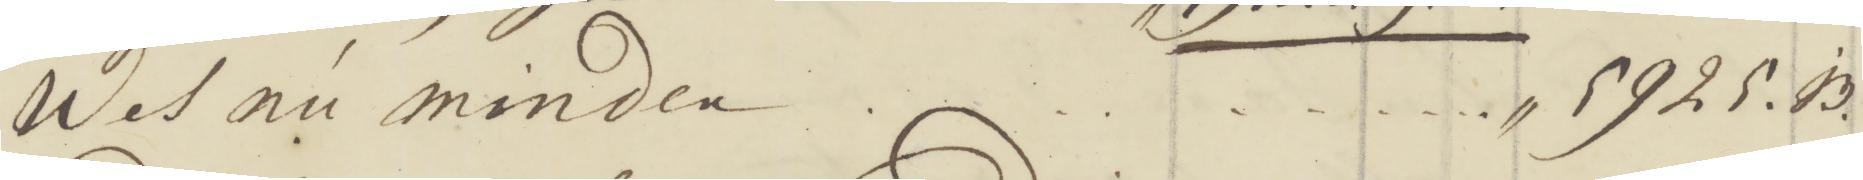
Wes nu minder . . . . . . . . . „ 5925. 13.
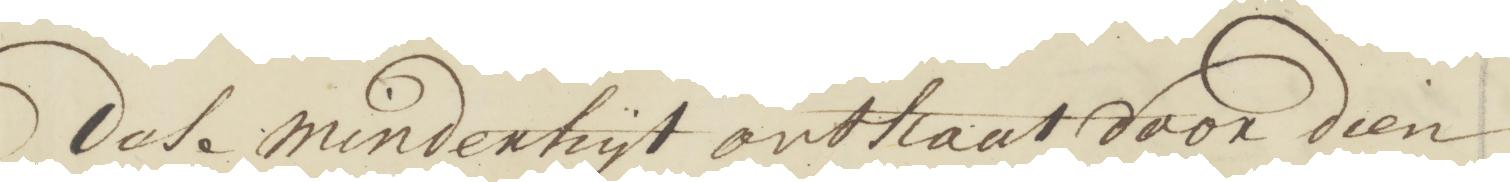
dese minderhijt ontstaat door dien
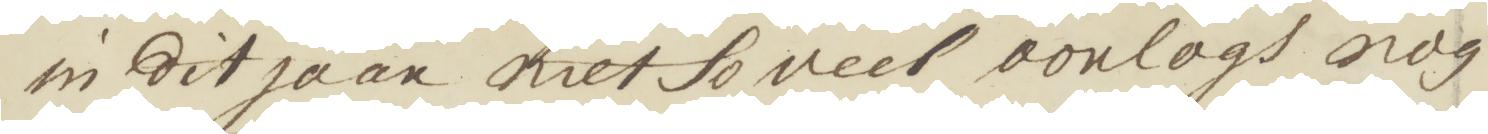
in dit jaar niet so veel oorlogs nog
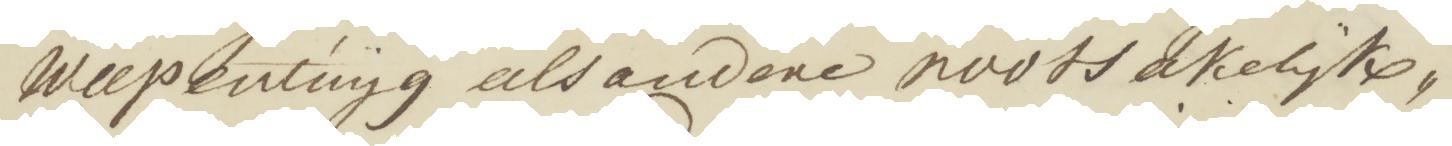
wapentuijg als andere nootsakelijk„
